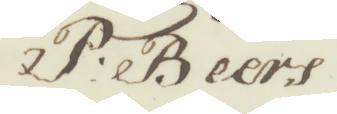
P: Beers
